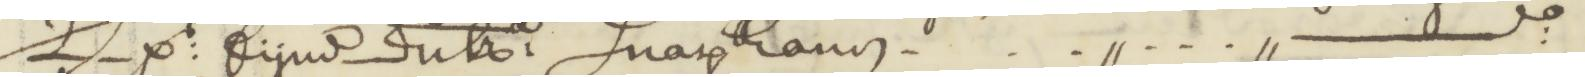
2 — p:s fijne vern:de snap hanen - - - „ - - - „ d:o
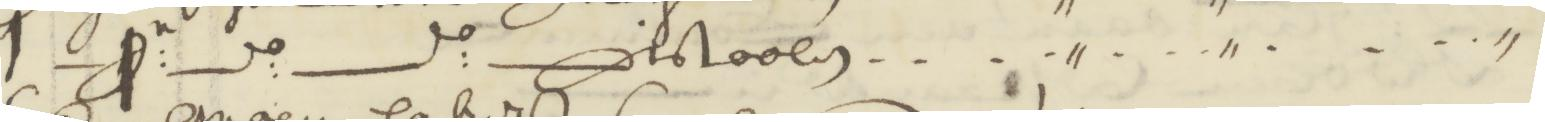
1 — p:r d:o d:o pistoolen - - - - „ - - - „ - - - - „
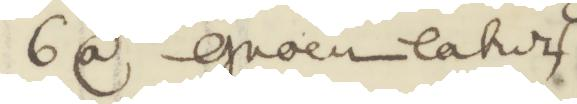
6 @ groen laken
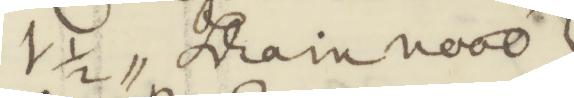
1½ „ schair rood }
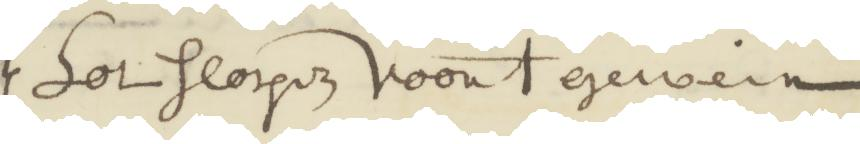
tot slopen Voor ’t geweir
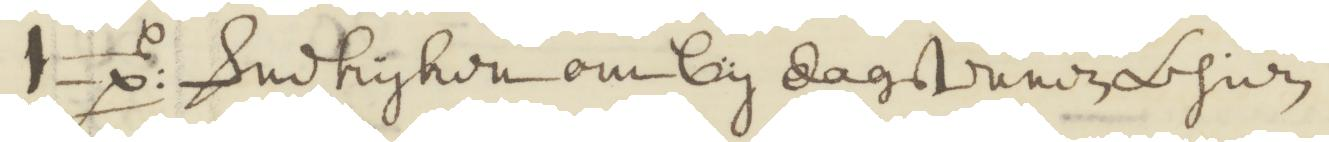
1 — p:s verrekijker om bij dagsterren tesien
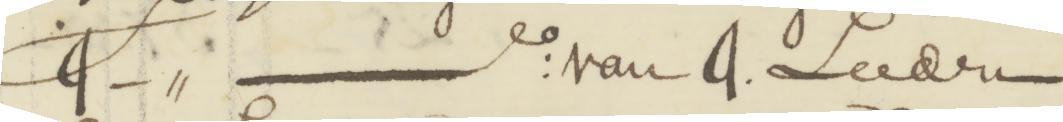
4 — „ d:o van 4. Leeden
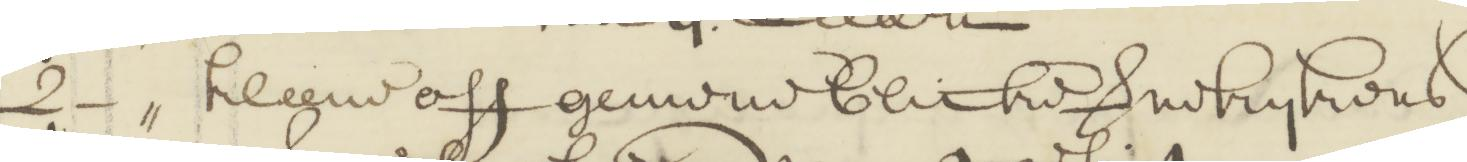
2 — „ kleene off gemene blicke verrekykers
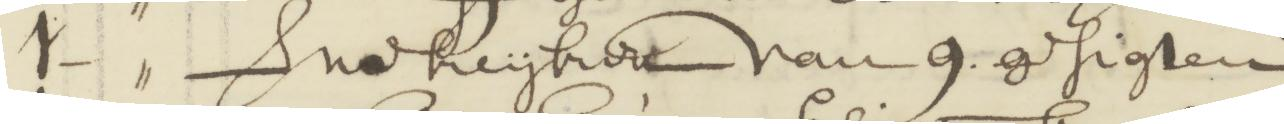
1 — „ verrekeijker Van 9. gesigten
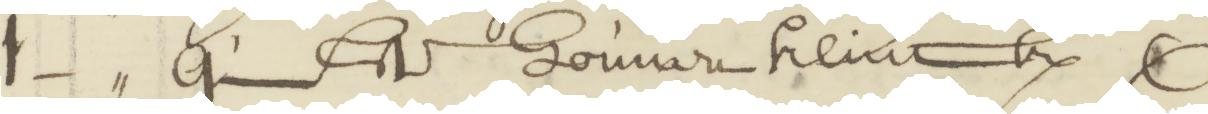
1 — „ g' Este Houwer klinck
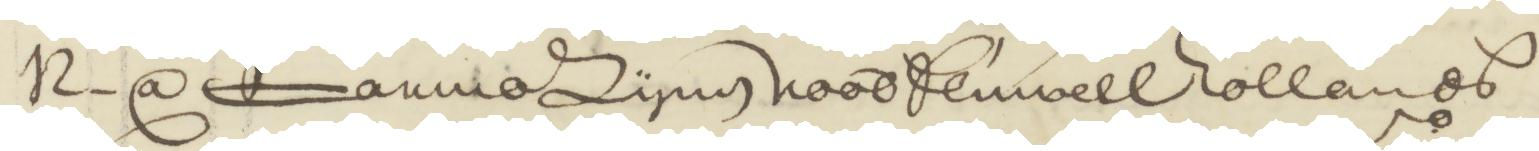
12 — @ Carmozijnen Rood fluweel Hollands
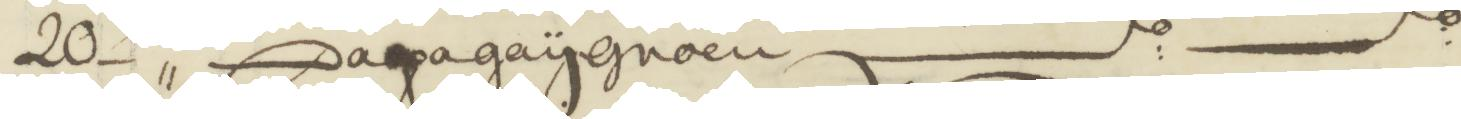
20 — „ Papagaijgroen D:o D:o
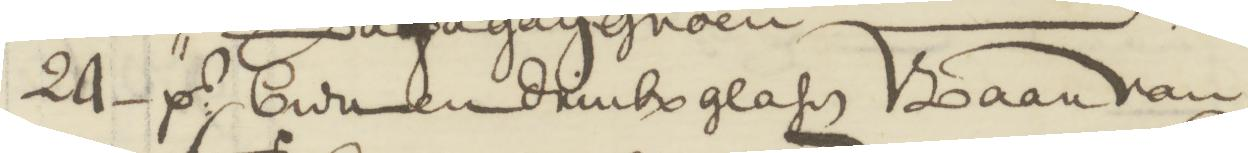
24 — p:s bier en drink glasen Waar Van
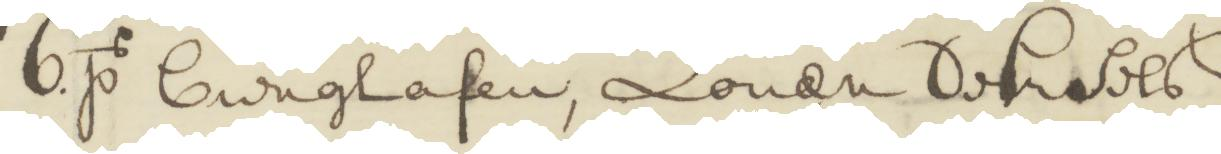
6. ps bierglasen, zonder deksels
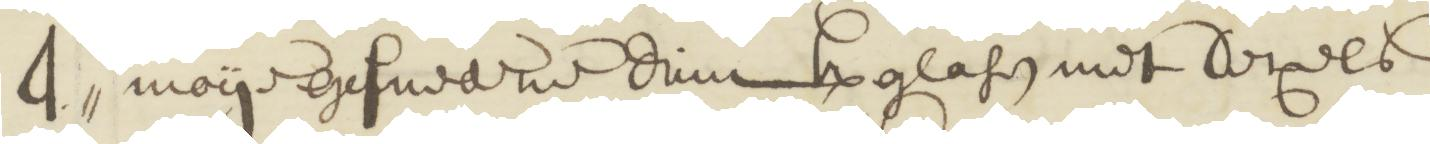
4. „ moije gesnedene drink glasen met dexels
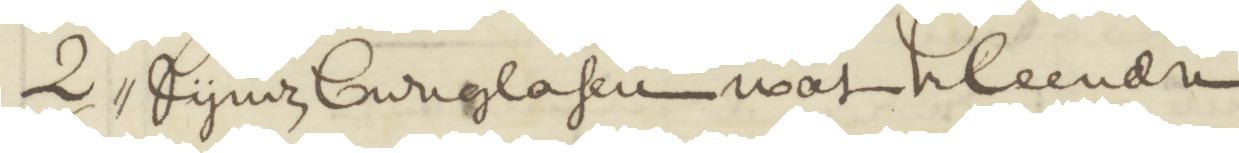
2 „ fijnen bierglasen wat kleender
